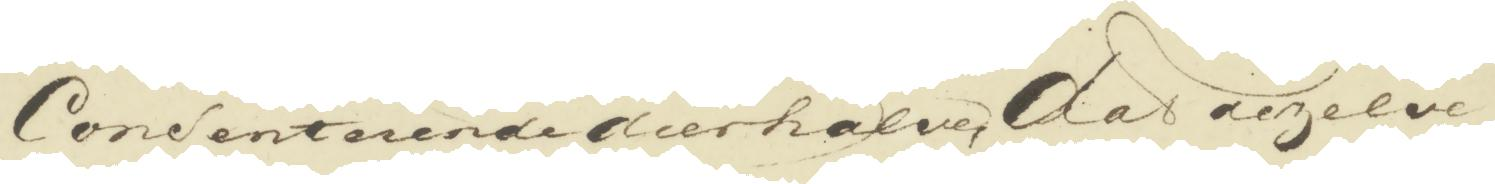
Consenterende dierhalve dat dezelve
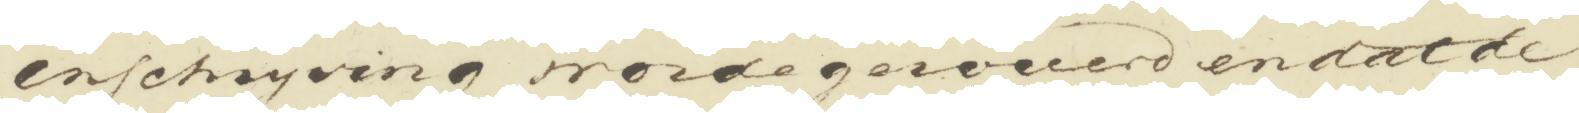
inschryving worde geroieerd en dat de
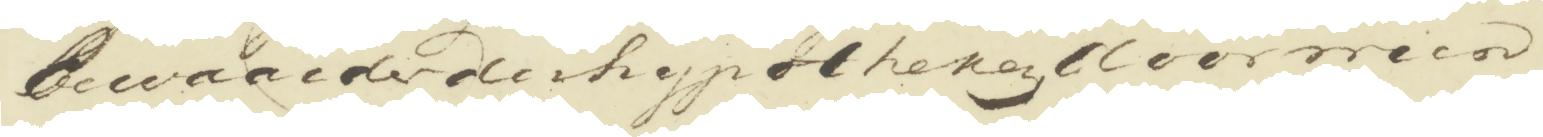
bewaarder der hypotheken door wien
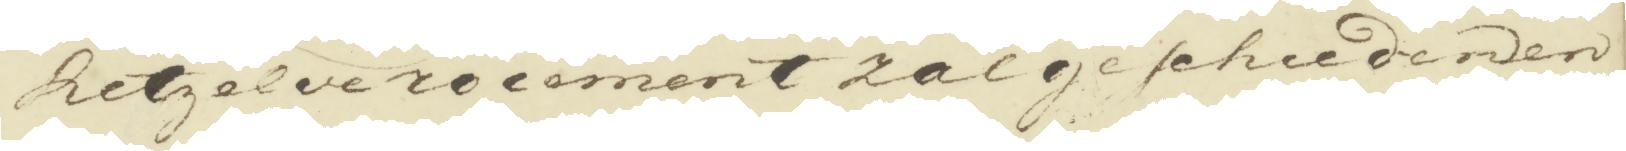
hetzelve roiement zal geschieden en
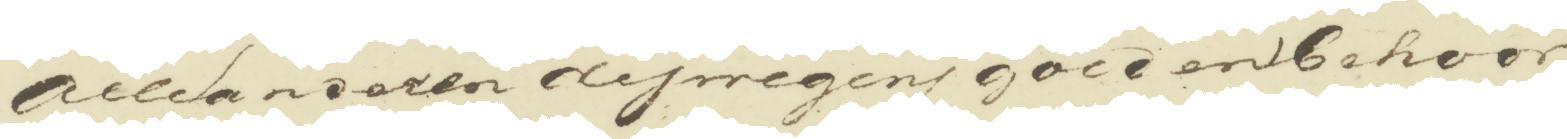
alle anderen de wegens goed en behoor
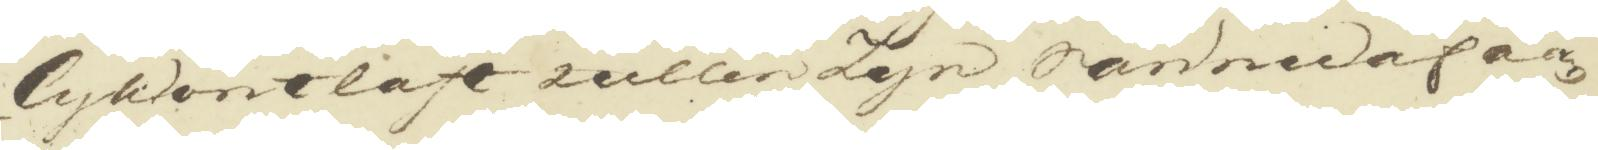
lyk ontlast zullen Zyn van nu af aan
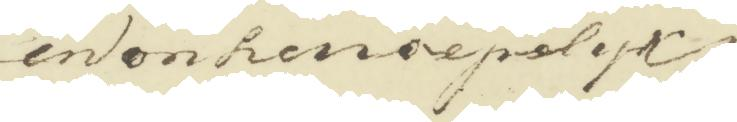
en onherroepelyk.
